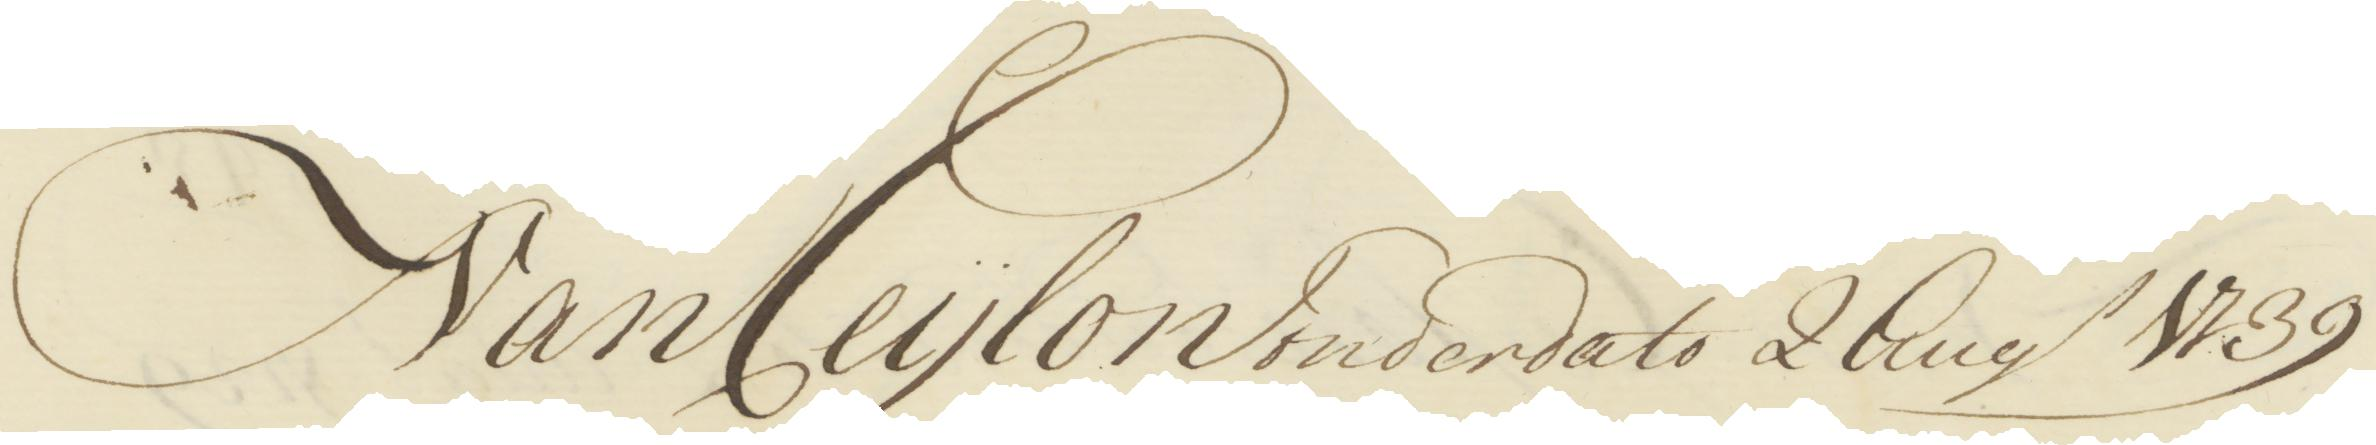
Van Ceijlon onder dato 2 Augs 1739
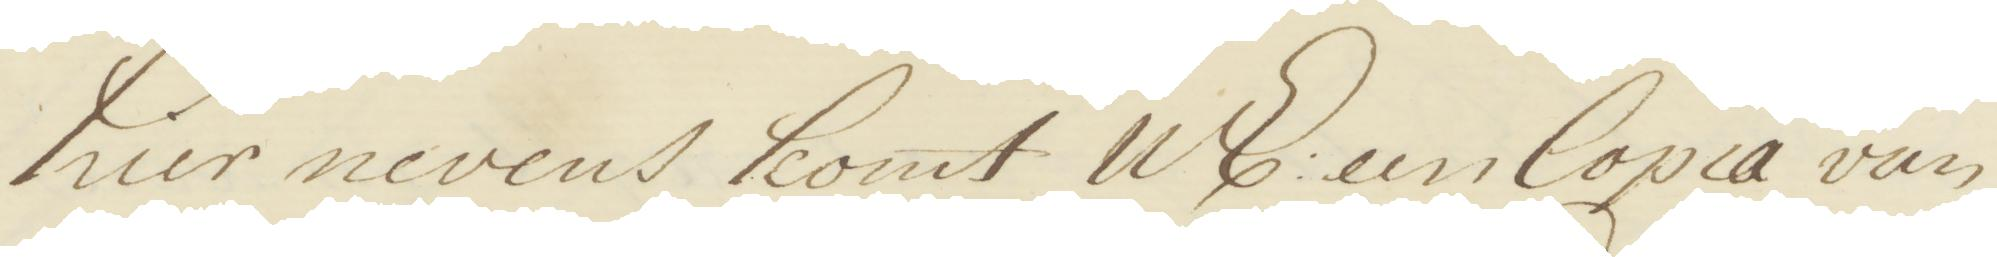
hier nevens komt UE: een Copia van
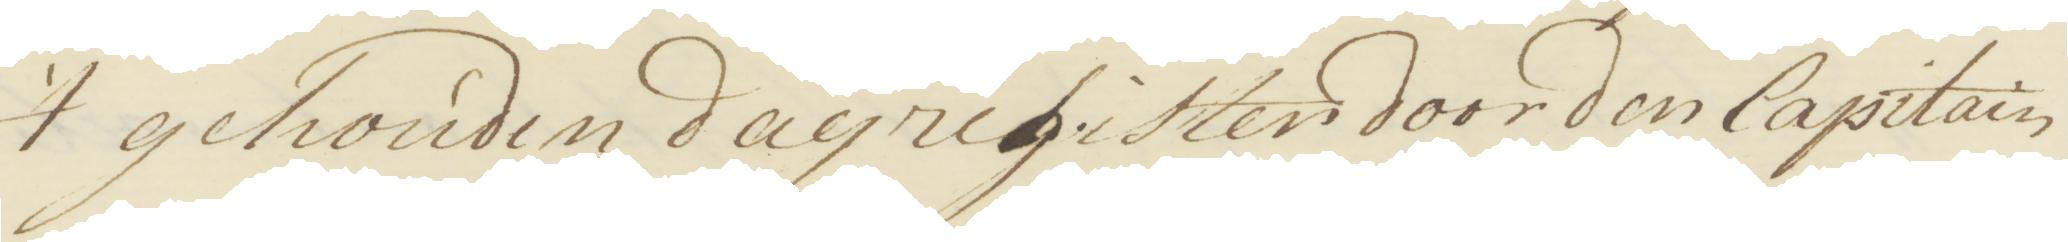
’t gehouden dagregister door den Capitain
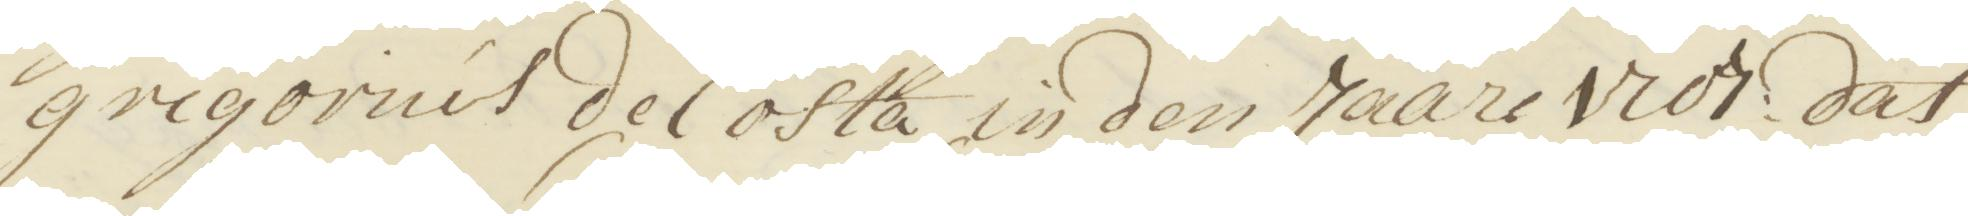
gregorius de Costa in den Jaare 1707: dat
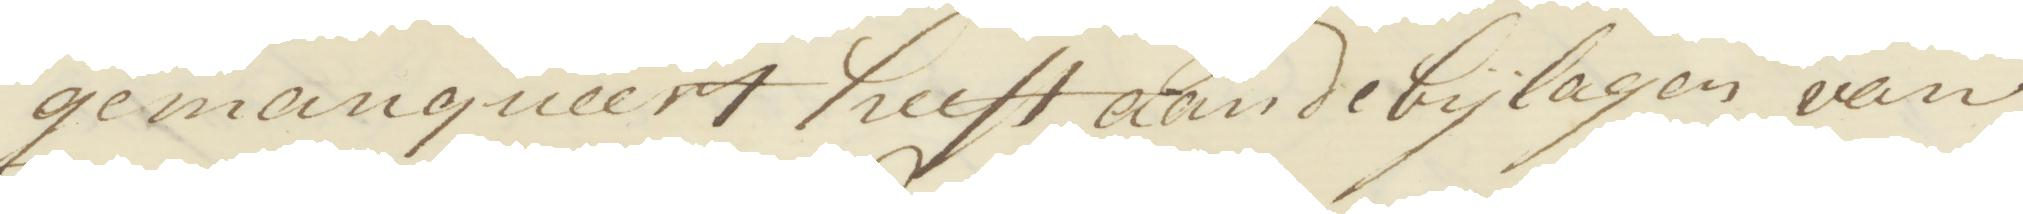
gemanqueert heeft aan de bijlagen van
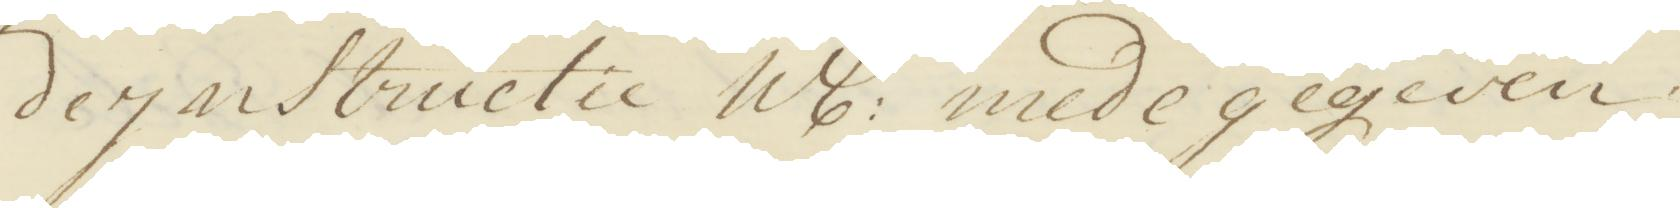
de jnstructie UE: mede gegeven.
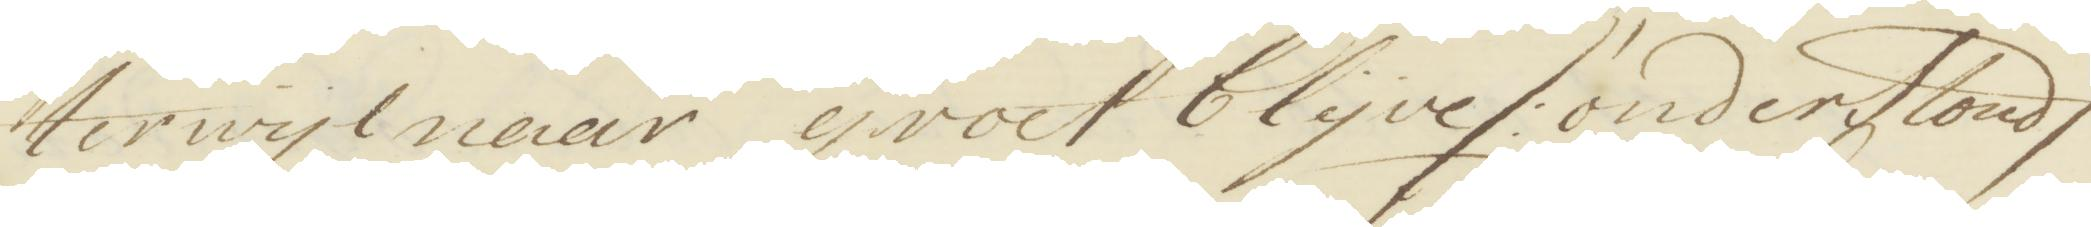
terwijl naar groet blijve /:onderstond/
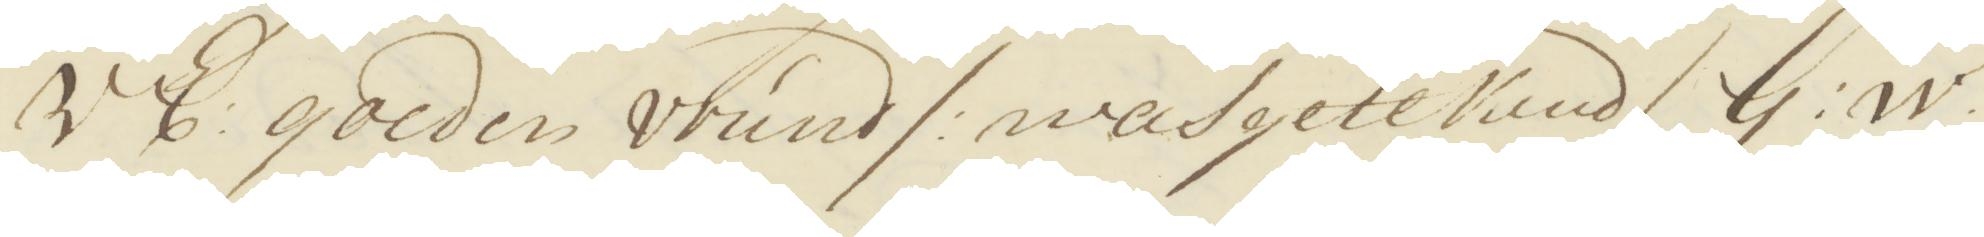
VE: goeden vrund /: was getekend/ G: w:
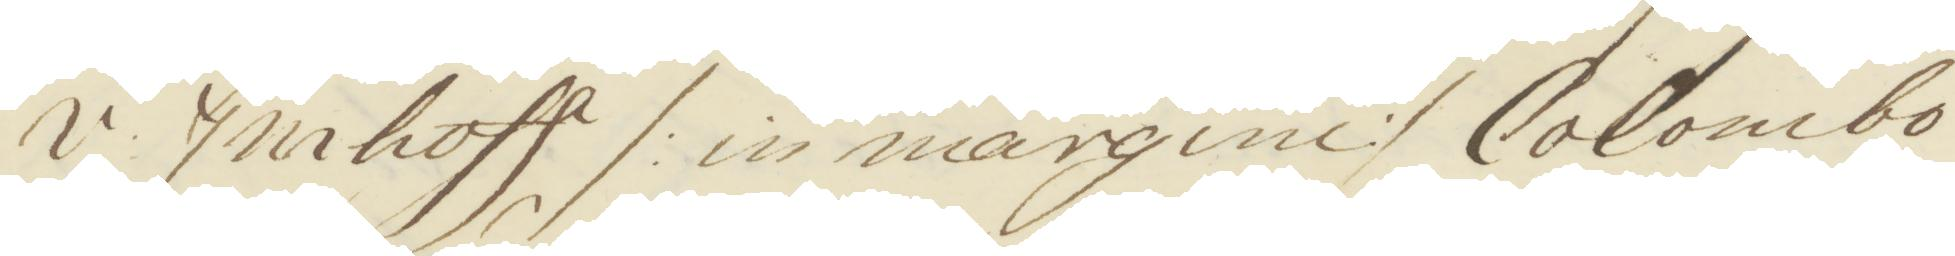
v. Jmhoff /: in margine:/ Colombo
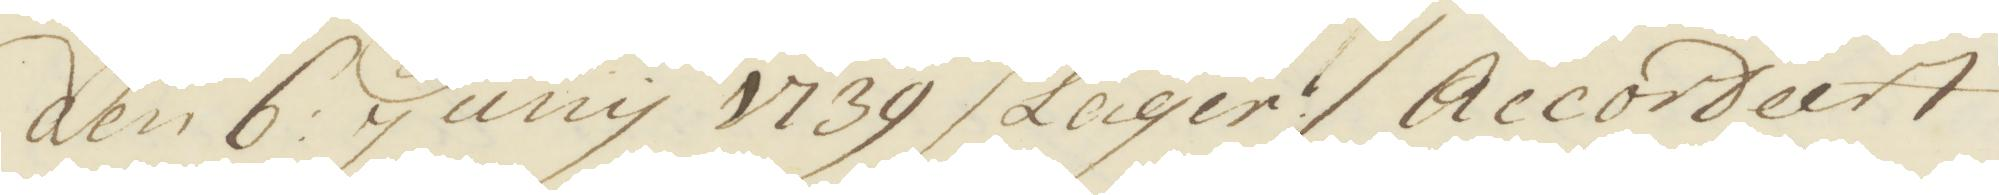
den 6: Junij 1739 / Lager:/ Accordeert
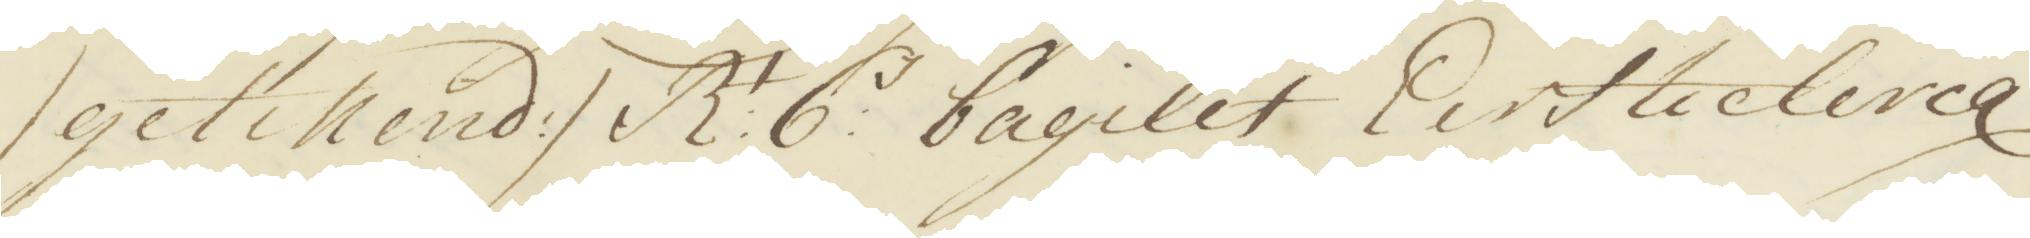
/getekend:/ R:t C:s bagilet Eerste clercq
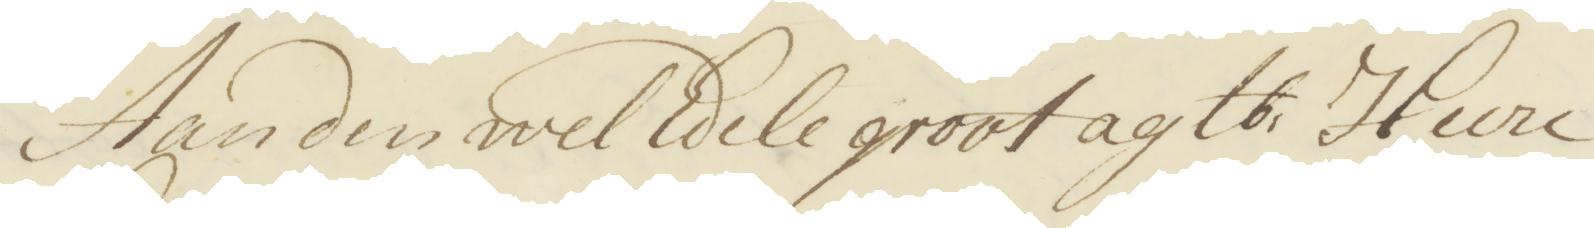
Aan den wel Edele groot agtb: Heere
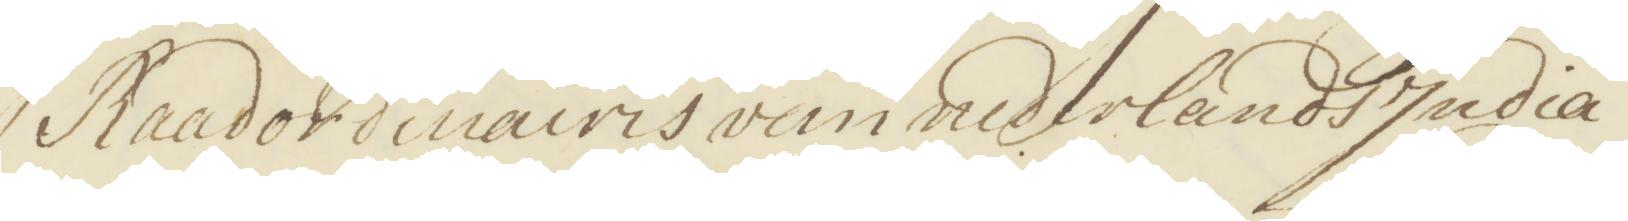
Raad ordinaris van nederlands Jndia
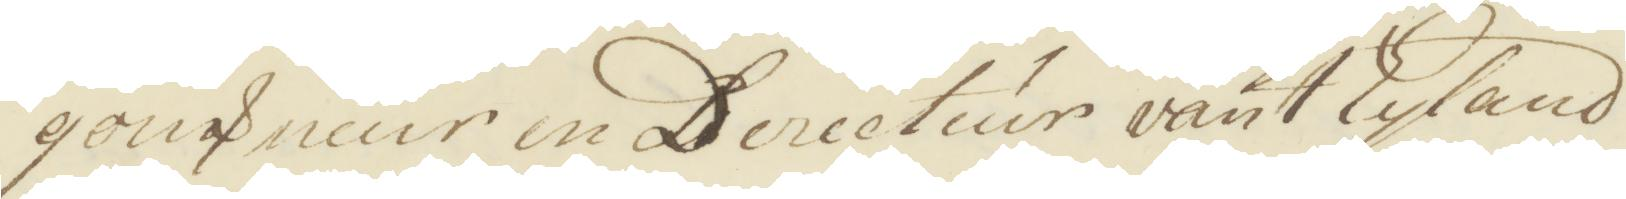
gouverneur en Derecteur van ’t Eyland
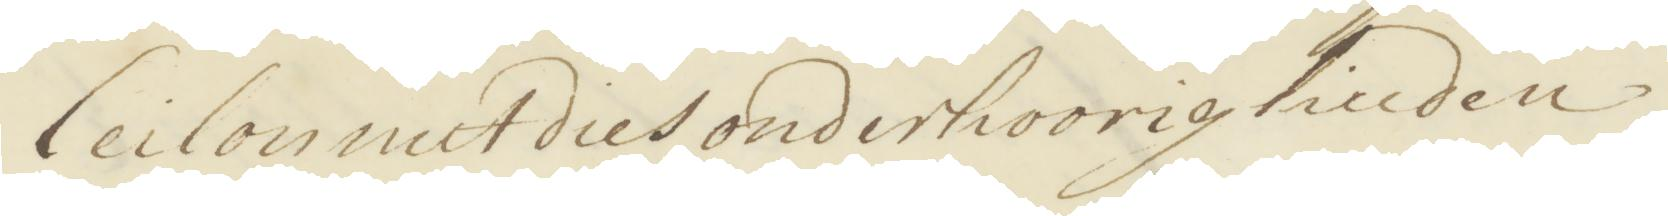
Ceilon met dies onderhoorig heeden
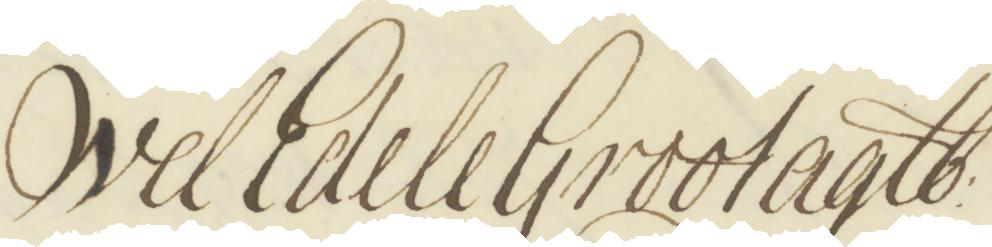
Wel Edele Groot agtb:
